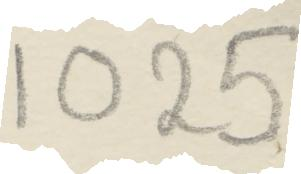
1025
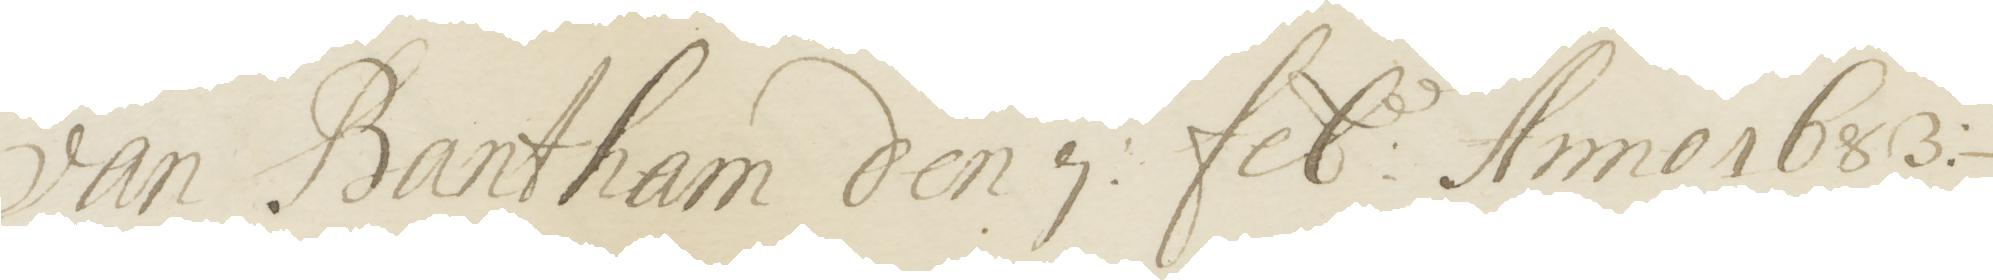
Van Bantham den 7: feb: Anno 1683:—
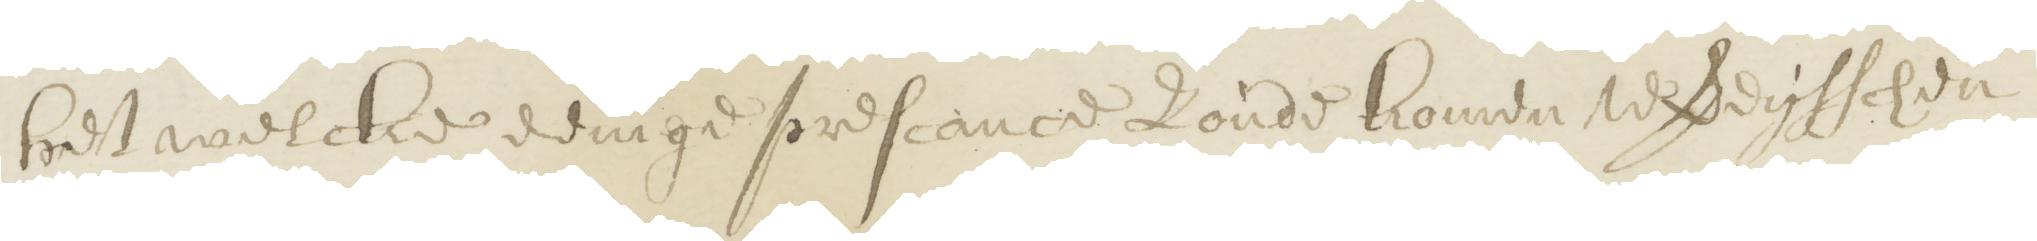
het welcke eenige prescance zoude komen te vereijsschen
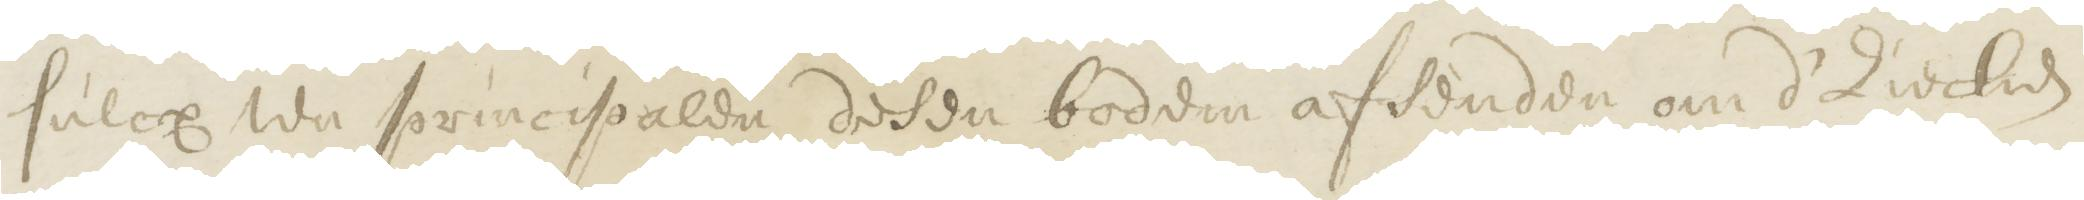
sulcx ten principalen desen bodem afsenden om d’ ziecken
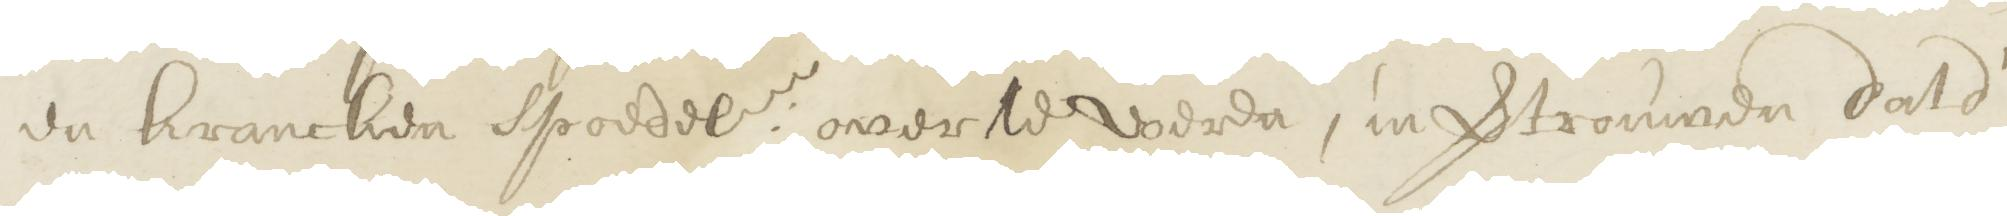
en krancken spoedel: over te voeren, in vertrouwen dat d’
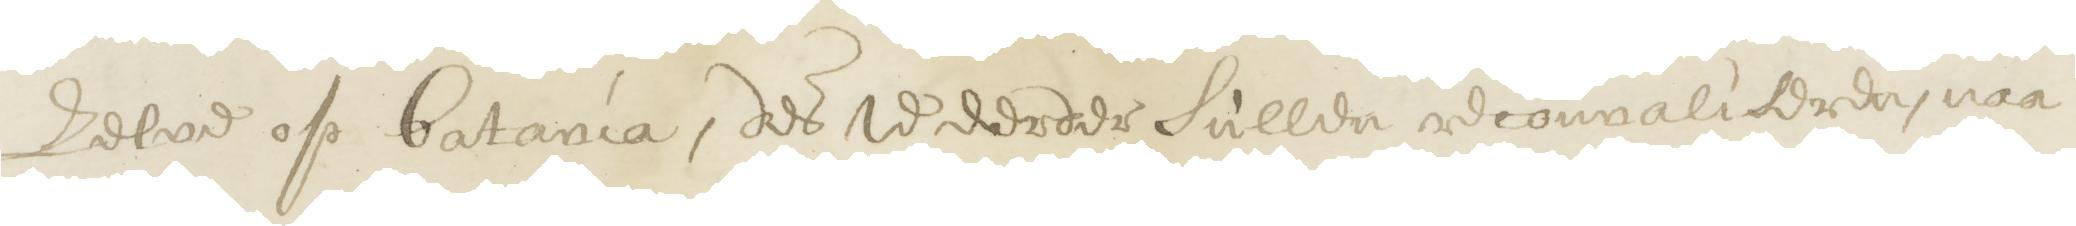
zelve op batavia, des te eerder sullen reconvaliseren, naa
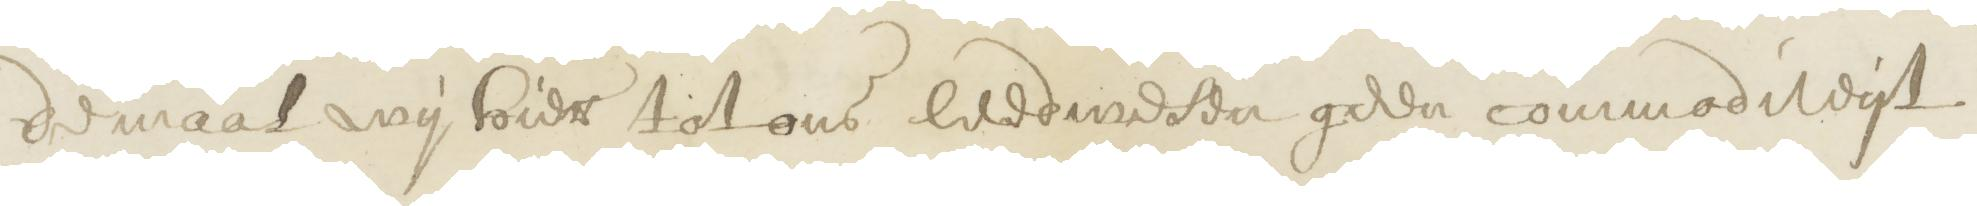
de maal wij hier tot ons leedwesen geen commoditeijt
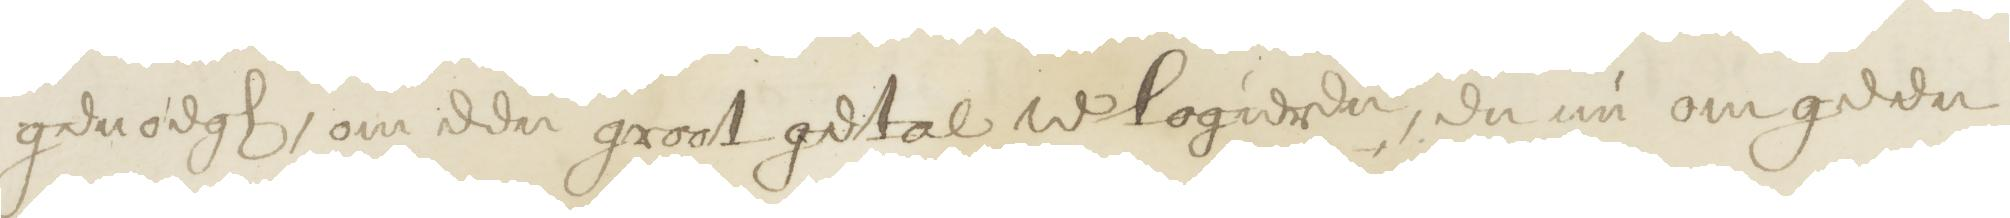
genoegh, om een groot getal te logieren, en nu om geen
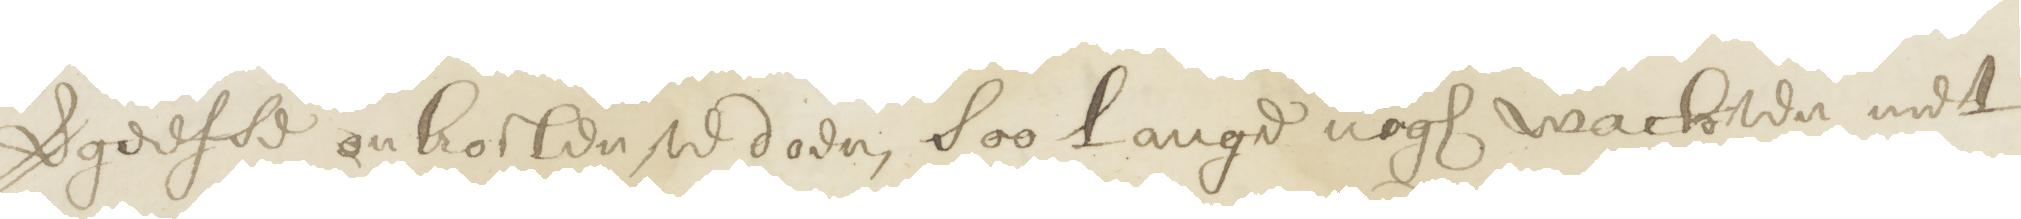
vergeefse onkosten te doen, soo lange nogh wachten met
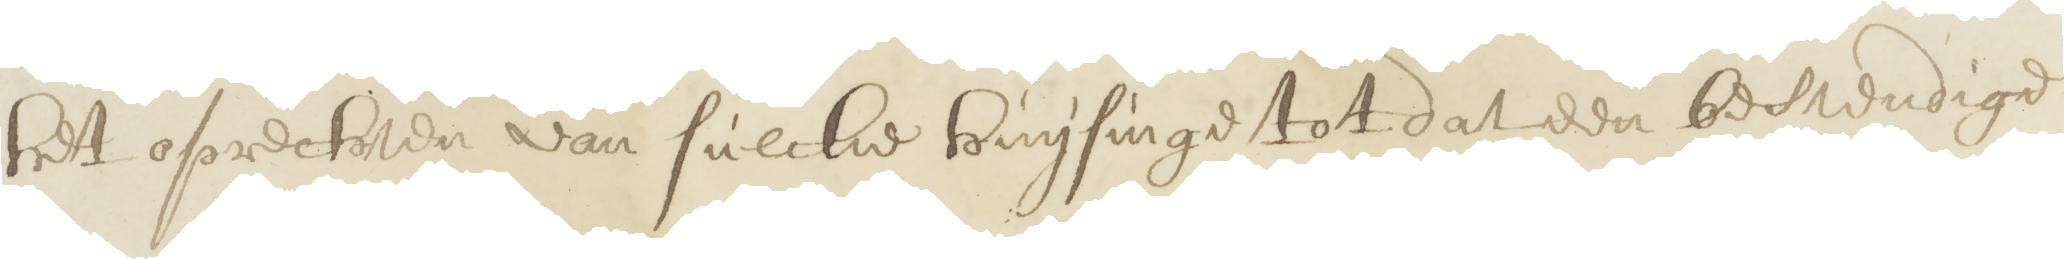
het oprechten van sulcke huijsinge tot dat een bestendige
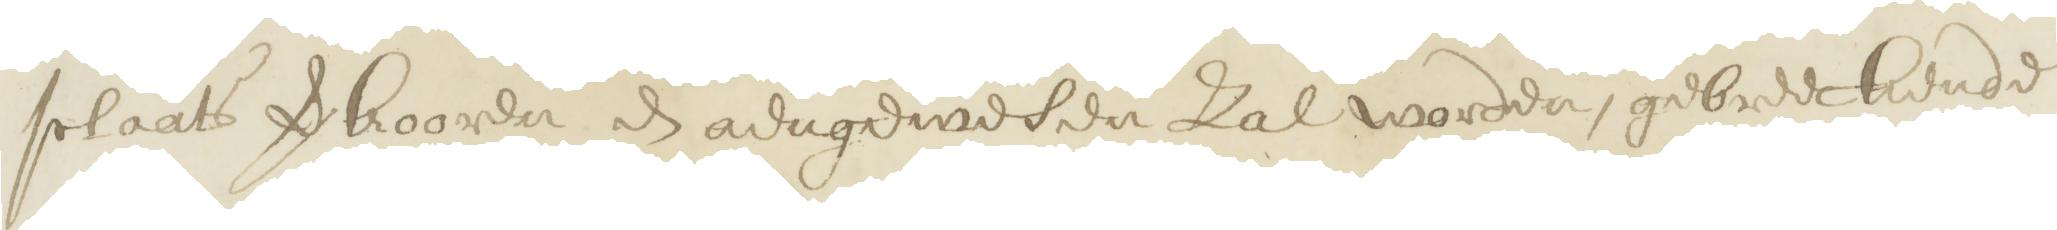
plaats verkooren en aengewesen zal worden, gebreeckende
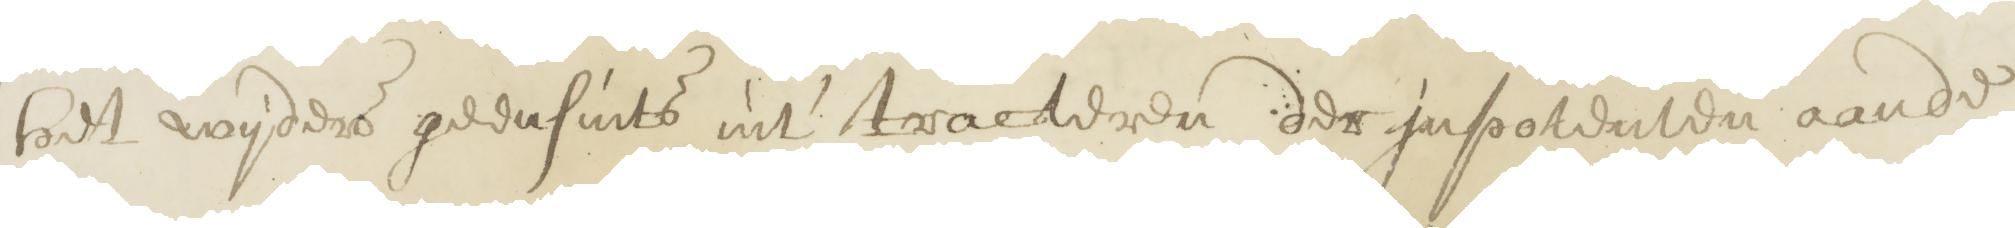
het wijders geensints int' tracteren der inpotenten aan de
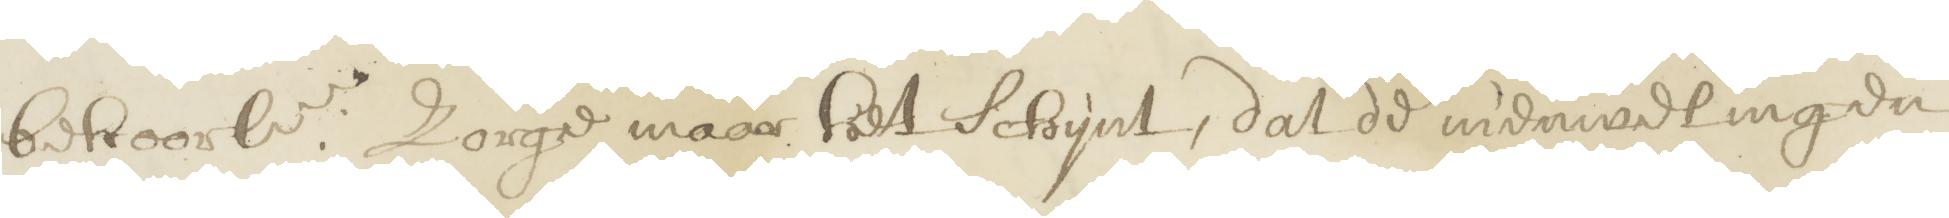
behoorl: zorge maar het schijnt, dat de nieuwelingen
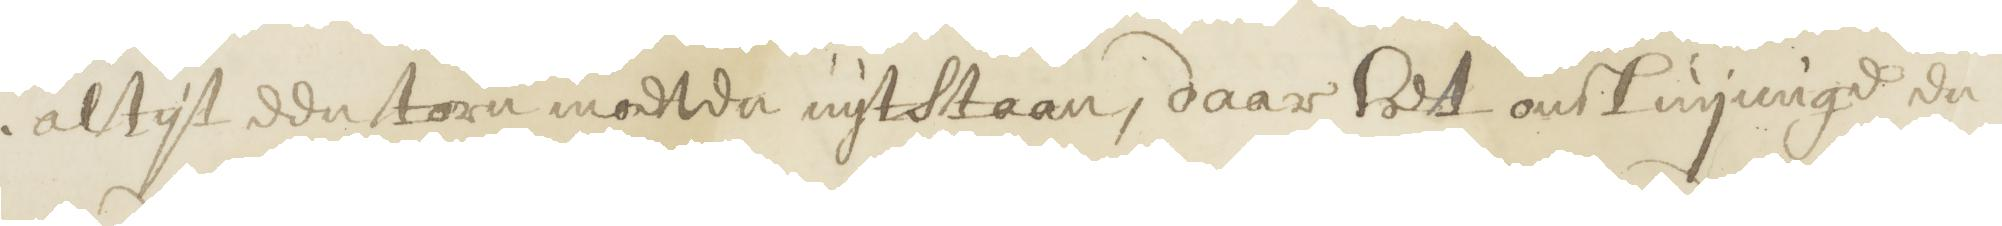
altijt een torn moeten uijtstaan, daar het ontluijmige en
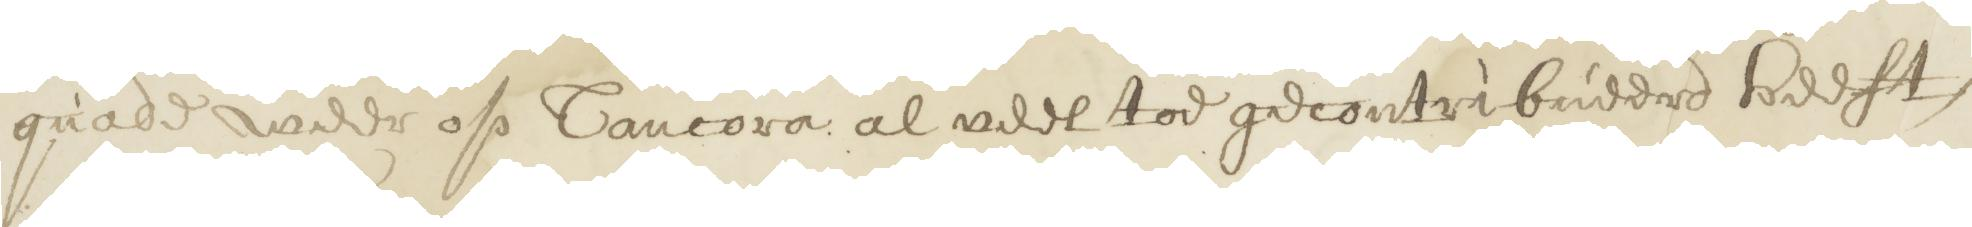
quade weer op Tancora al veel toe gecontribueerd heeft,
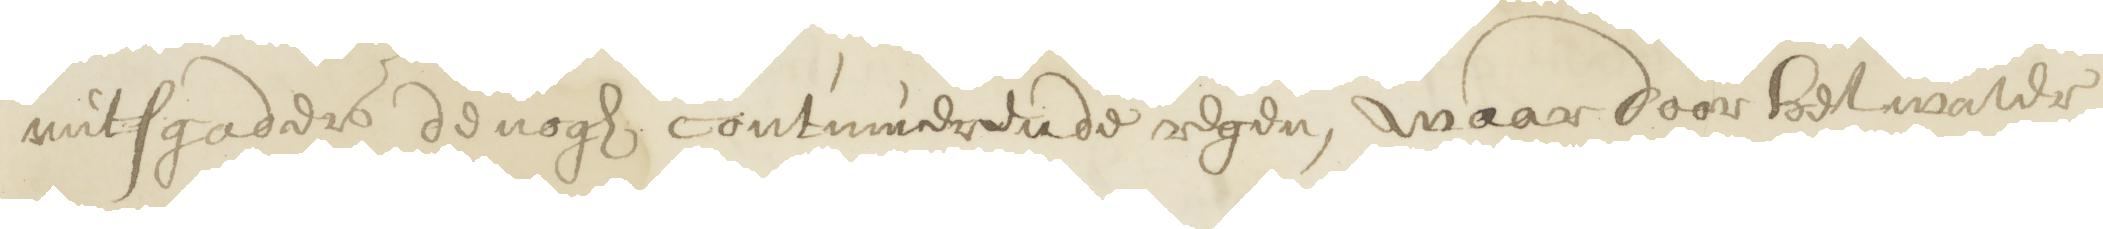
mitsgaders de nogh continuerende regen, waar door het water
